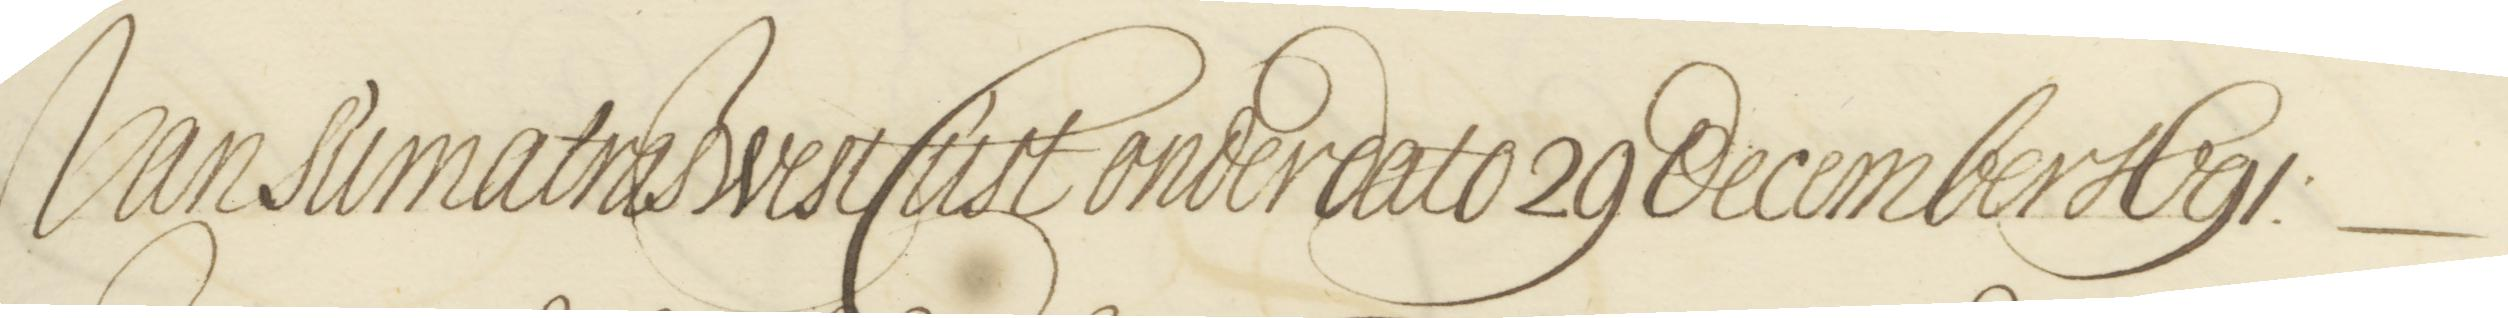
Van Sumatra West Cust onder Dato 29 December 1691:—
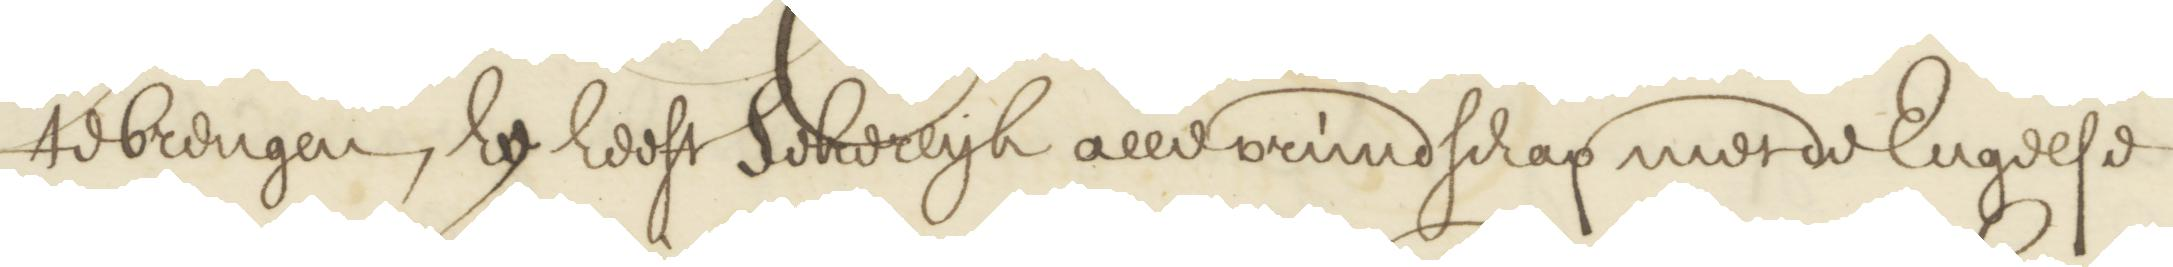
tebrengen, hy heeft sekerlijk alle vrundschap met de Engelse
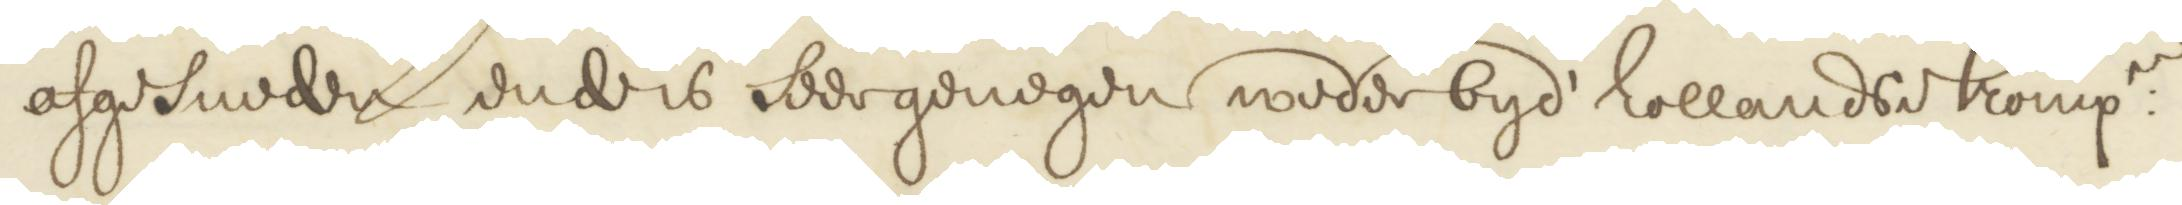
afgesneden ende is seer genegen weder byd' hollandse komp:e
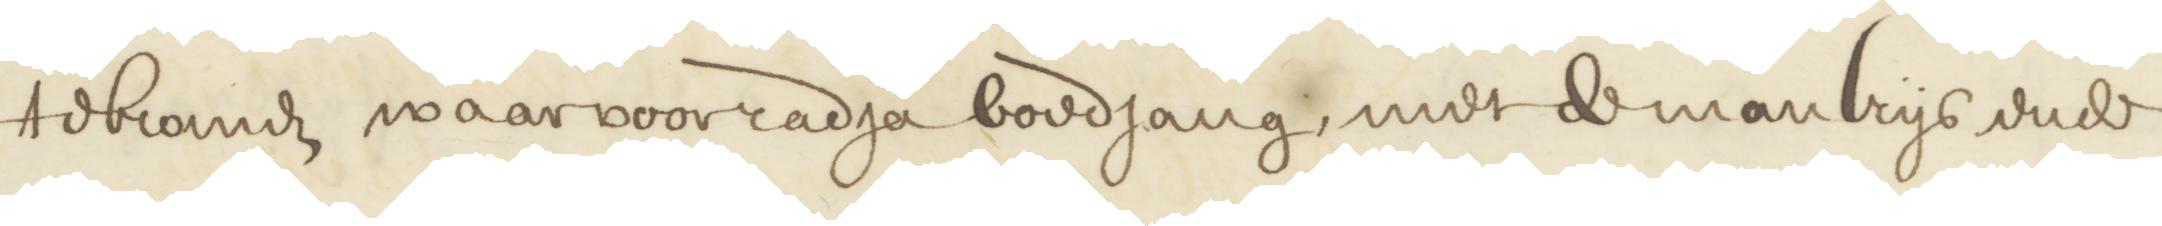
tekomen waar voor radja boedjang, met de mantrijs ende
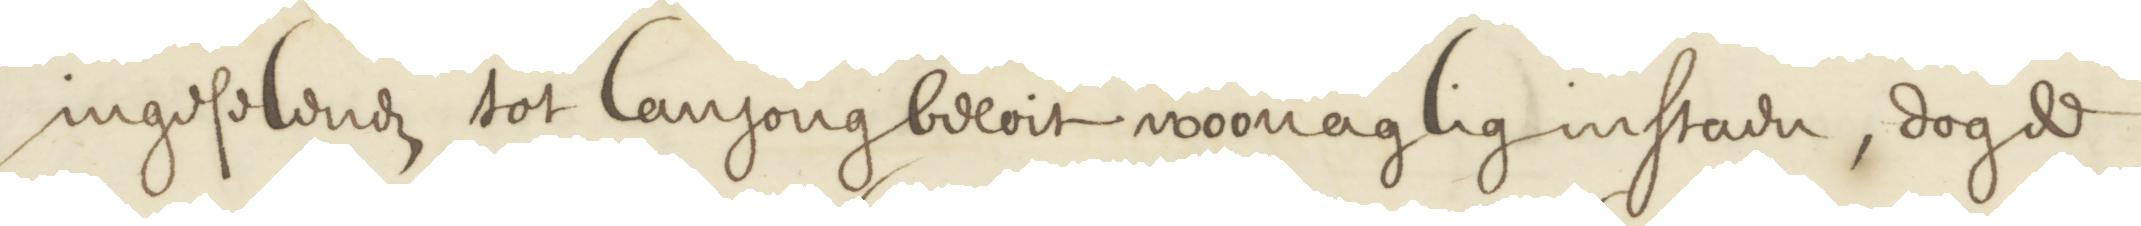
ingesetenen tot tanjong beloit woonagtig instaen, dog de
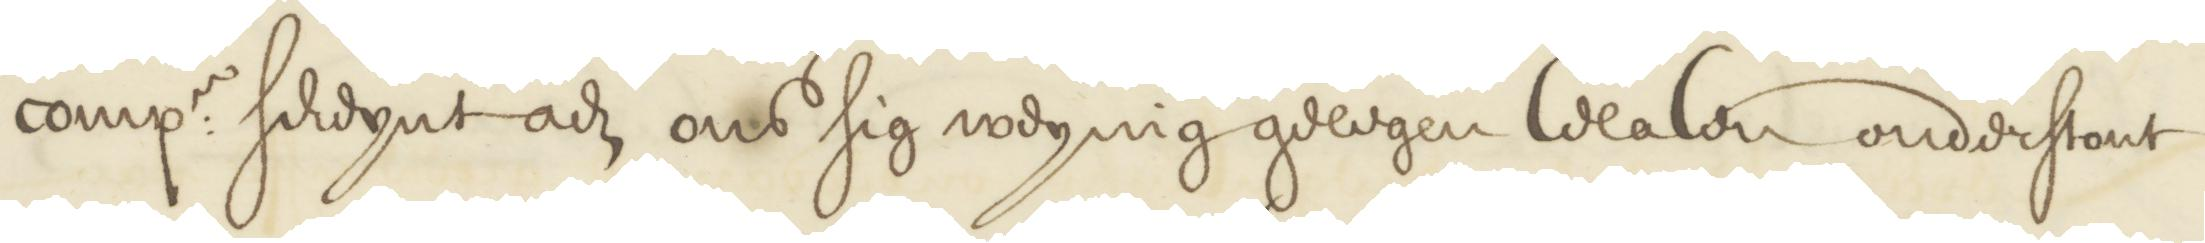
comp:e scheynt aen ons sig weynig gelegen telaten onderstont
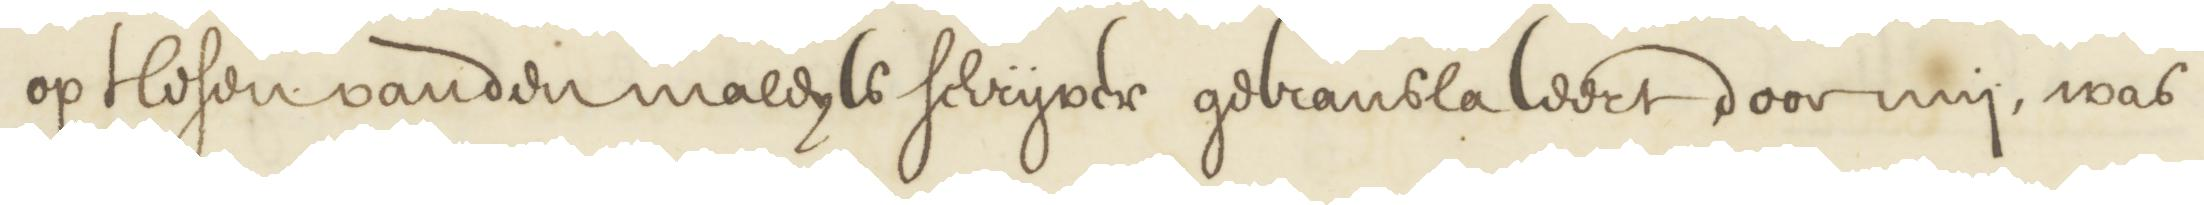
op tlesen van den maleyts schrijver getranslateert door mij, was
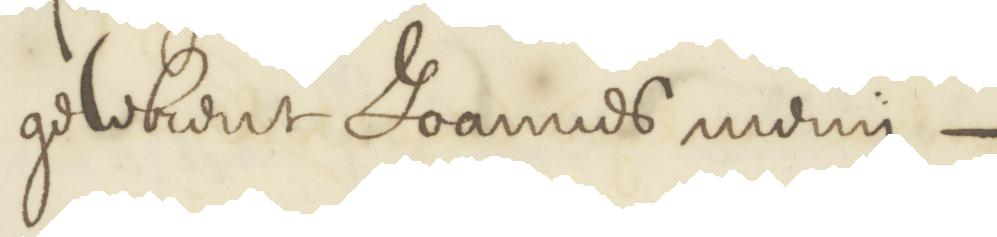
getekent Ioannes menij
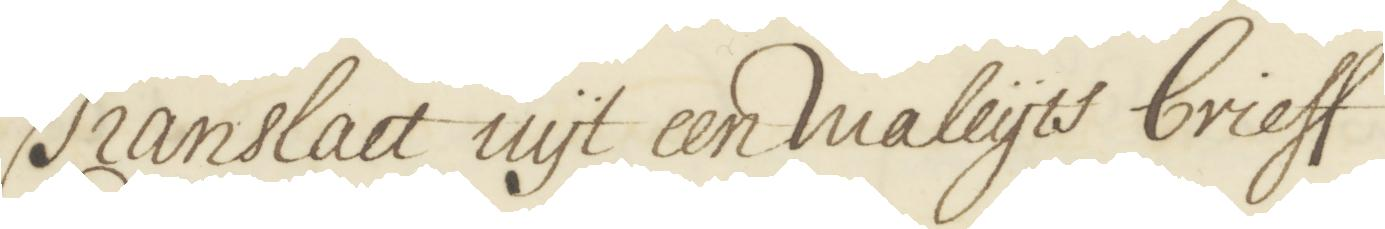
Translaet uijt een Maleijts brieff
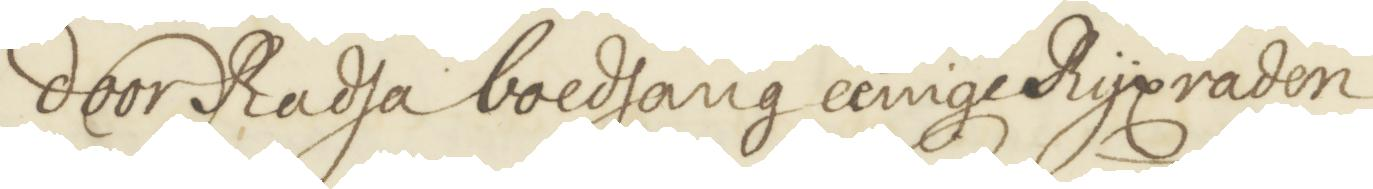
door Radja boedjang eenige Rijxraden
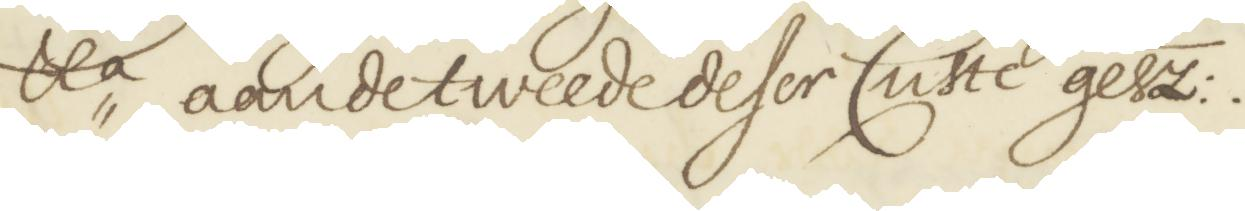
Et„a aan de tweede deser Custe gesz:
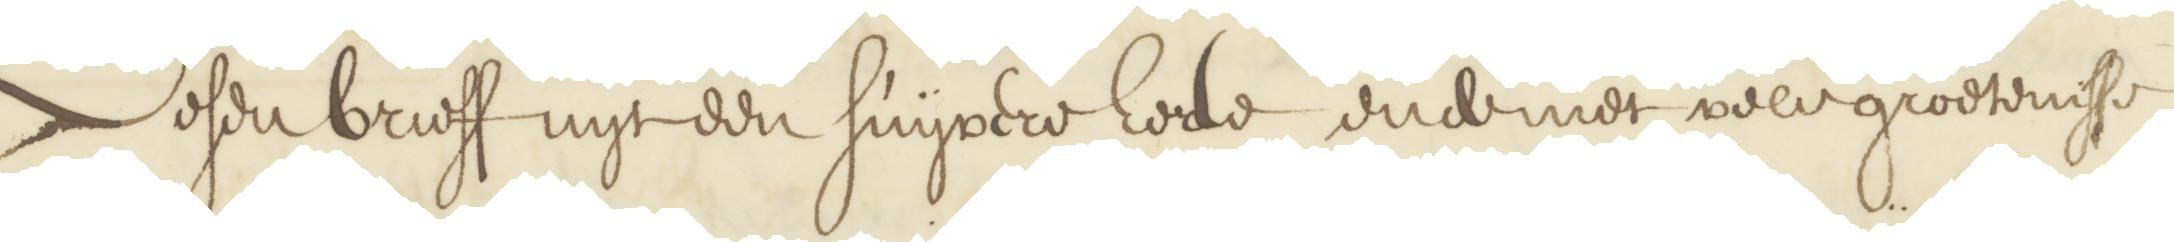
Desen brieff uyt een suijvere herte ende met vele groetenisse
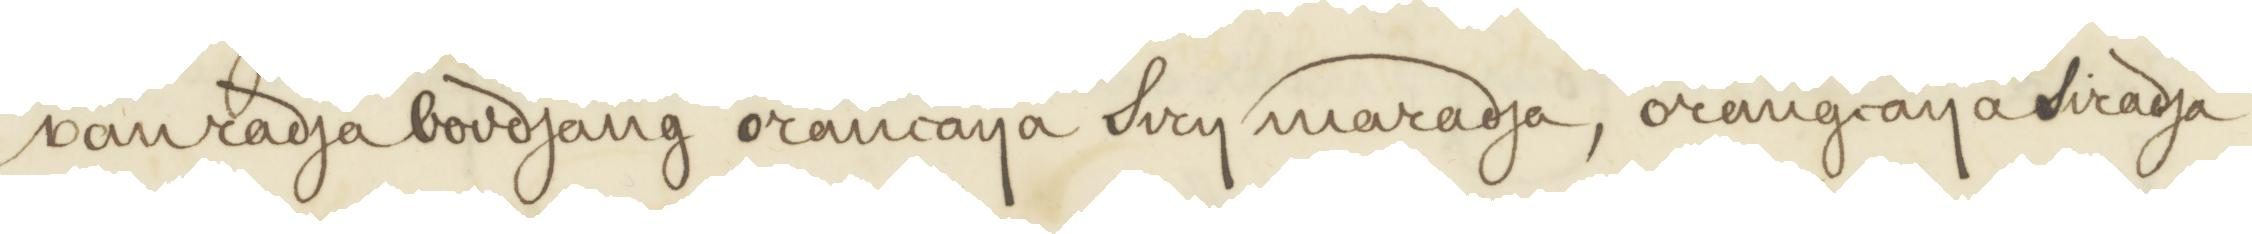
van radja boedjang orancaija siry maradja, orangcaija siradja
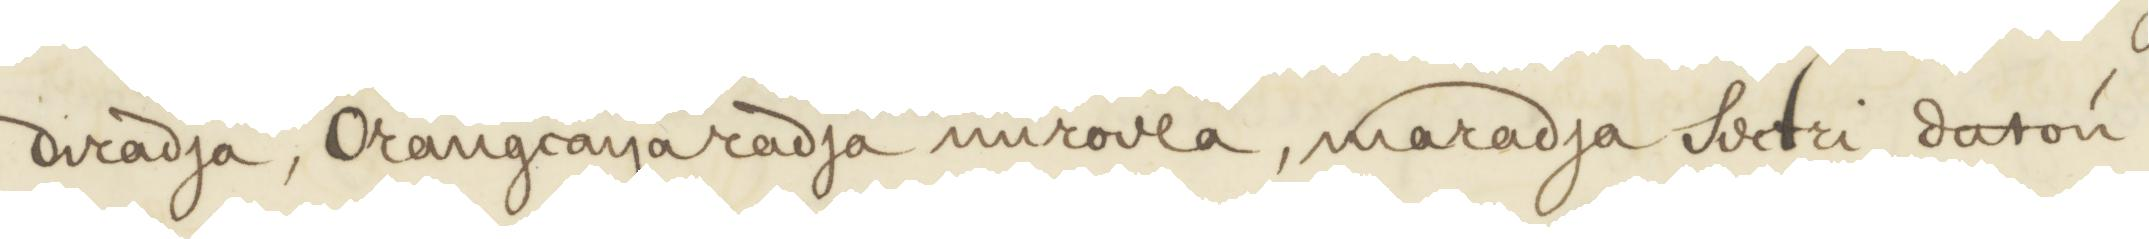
diradja, Orangcaijaradja miroela, maradja sectri datou
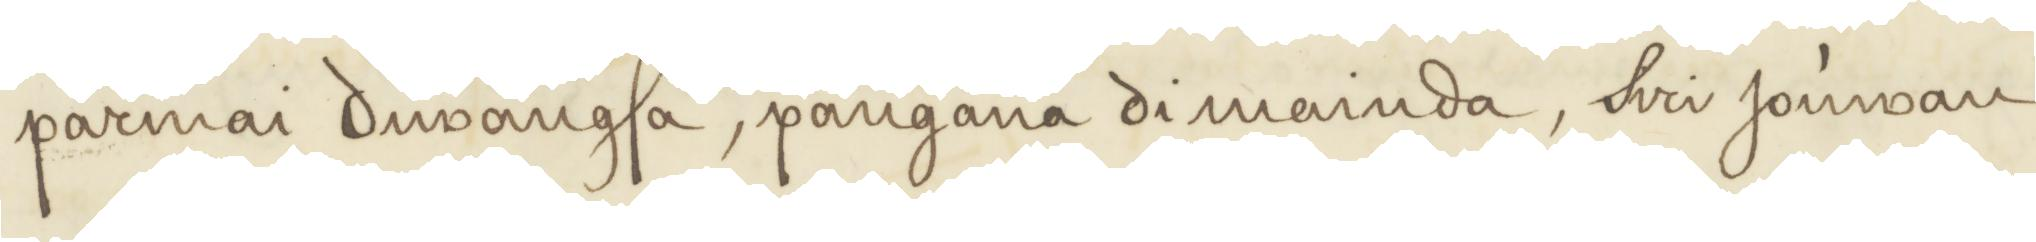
parmai diwangsa, pangaua dimainda, siri jouwan
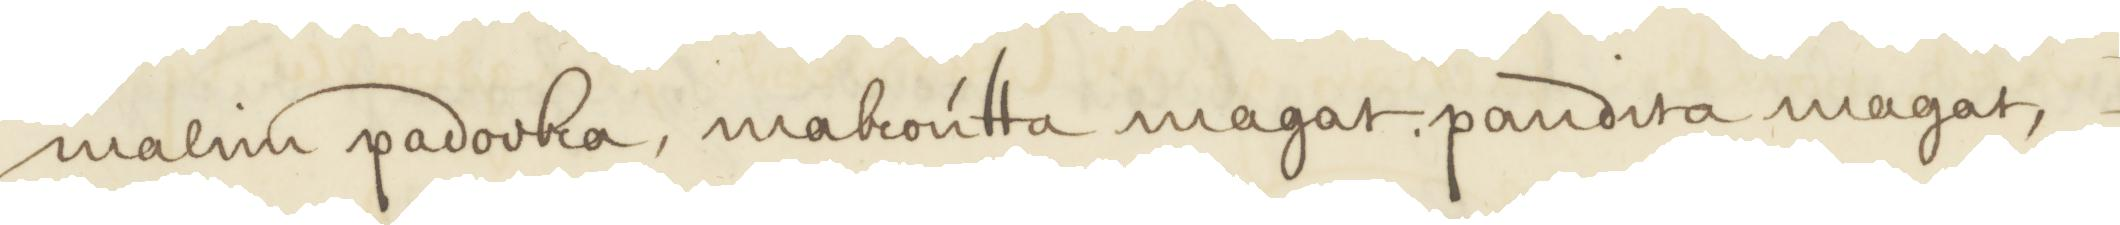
malim padoeka, makoutta magat pandita magat,
